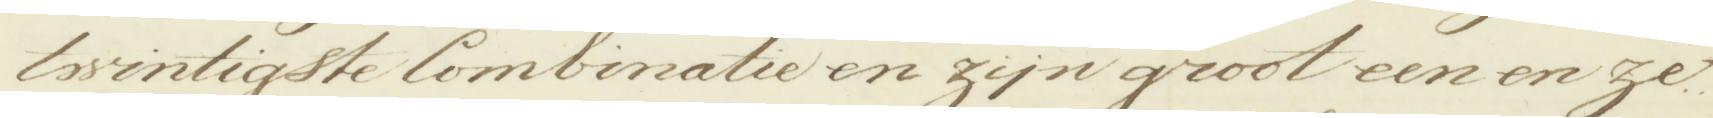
twintigste Combinatie en zijn groot een en ze.
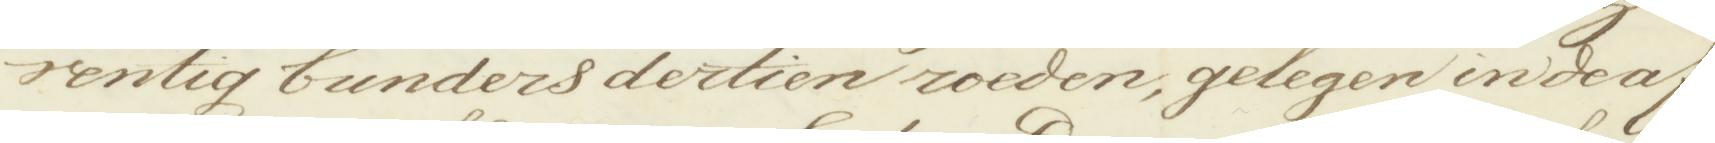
ventig bunders dertien roeden, gelegen in de af
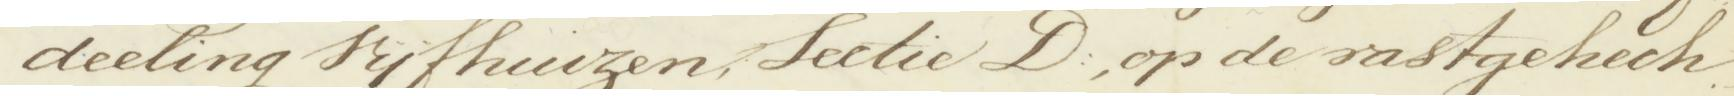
deeling Vijfhuizen, sectie D:, op de vastgehech,
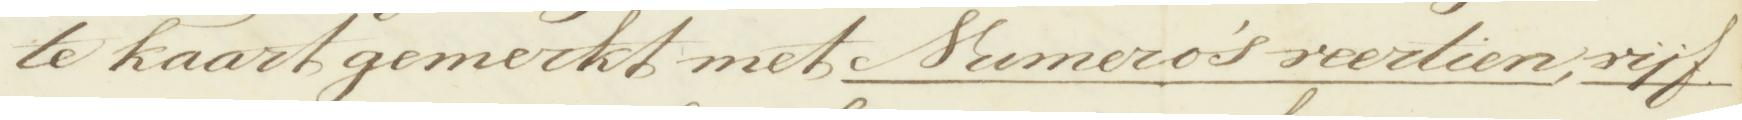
te kaart gemerkt met Numero's veertien, vijf.
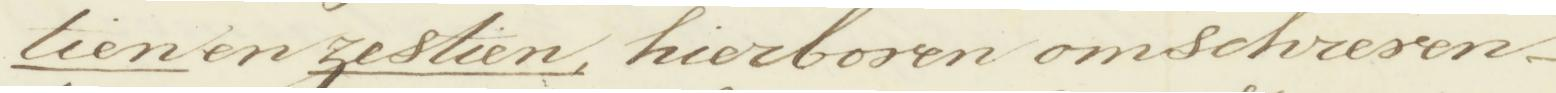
tien en zestien, hierboven omschreven. —
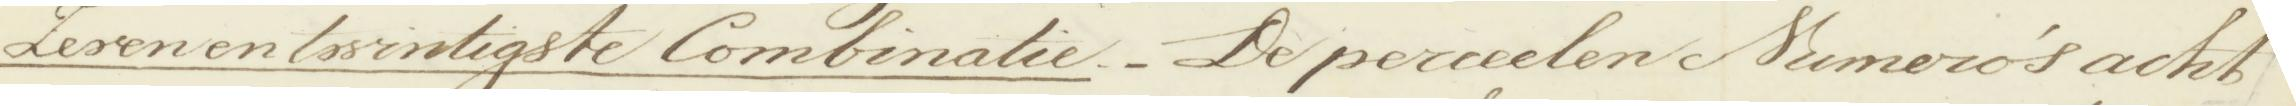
Zeven en twintigste Combinatie. - De perceelen Numero's acht
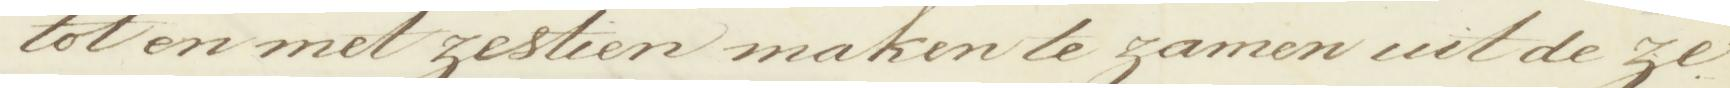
tot en met zestien maken te zamen uit de ze.
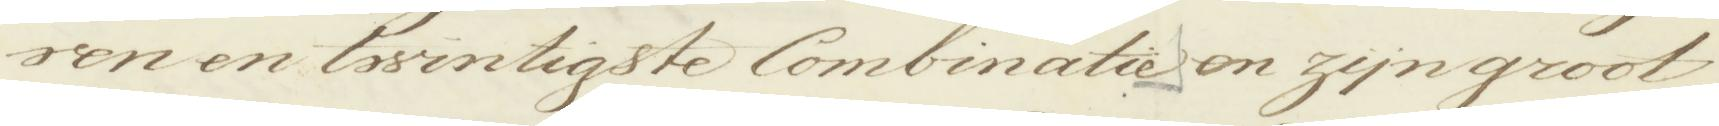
ven en twintigste Combinatie, en zijn groot
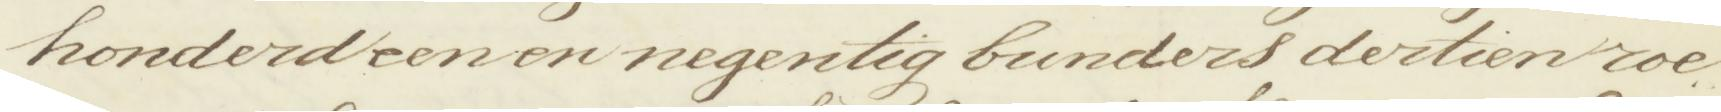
honderd een en negentig bunders dertien roe„
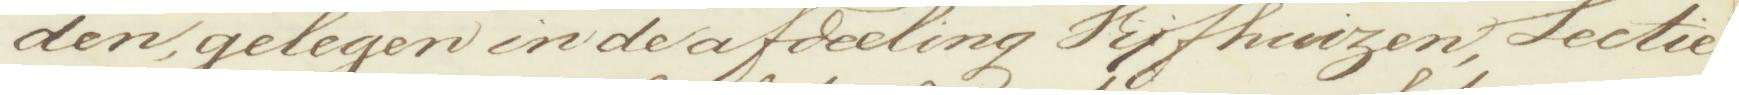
den, gelegen in de afdeeling Vijfhuizen, sectie
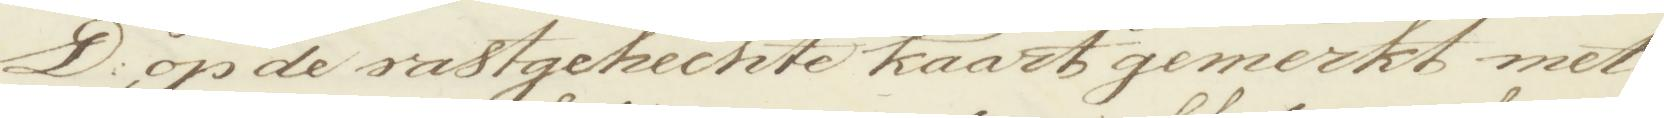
D:, op de vastgehechte kaart gemerkt met
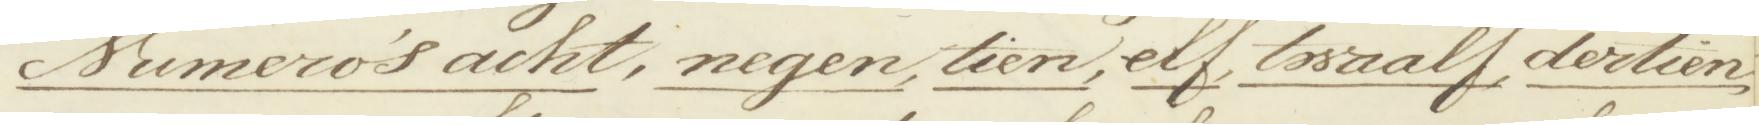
Numero's acht, negen, tien, elf, twaalf, dertien
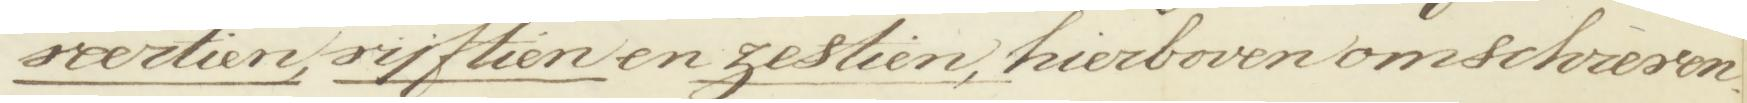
veertien, vijftien en zestien, hierboven omschreven
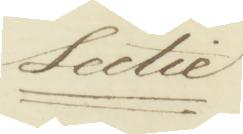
sectie
